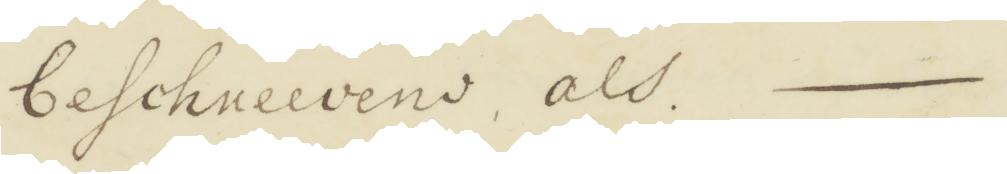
beschreevene, als. —
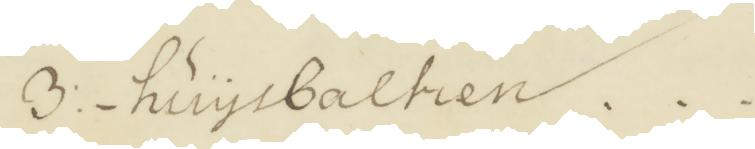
3: — huijsbalken . .
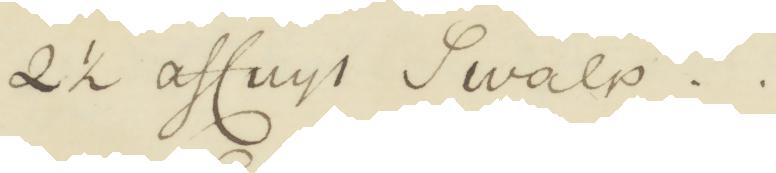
2½ affuijt swalp .
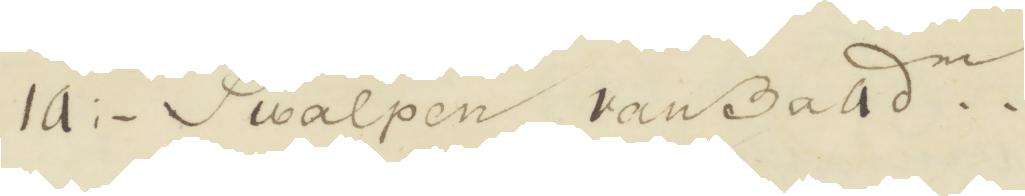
14: — swalpen van 3 a 4 dm .
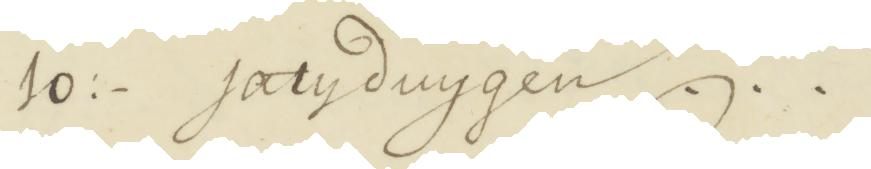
10: — jatyduygen . . .
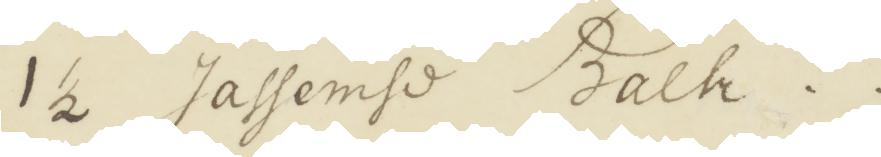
1½ Jassemse Balk .
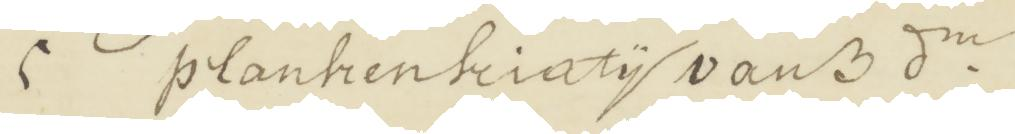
5 planken kiatij van 3 d.m
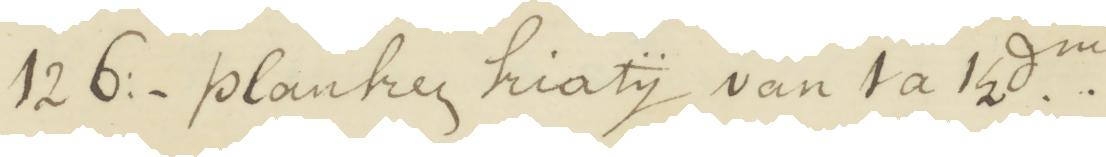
12 6: — planken kiatij van 1 a 1/2 d.m.
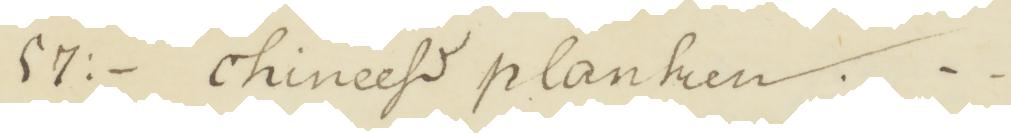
57: — chineese planken . -
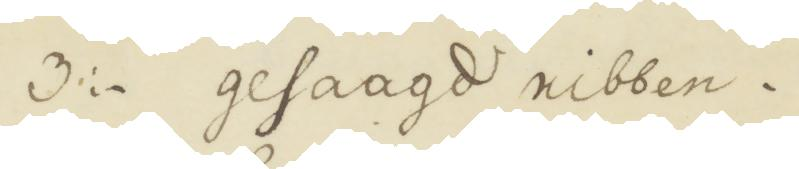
3: — gesaagde ribben -
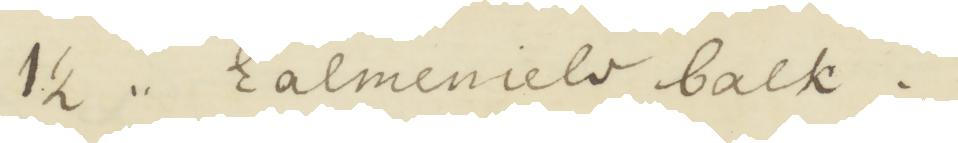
12 „ halmeniele balk .
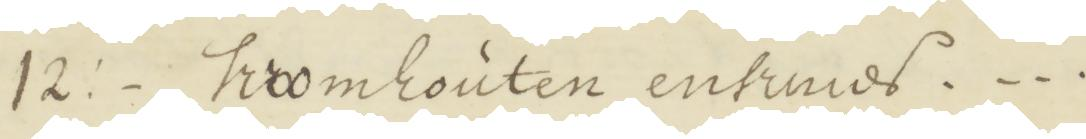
12: — kromhouten enknies . --
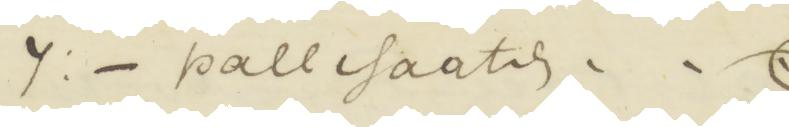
7: — pallisaaten - -
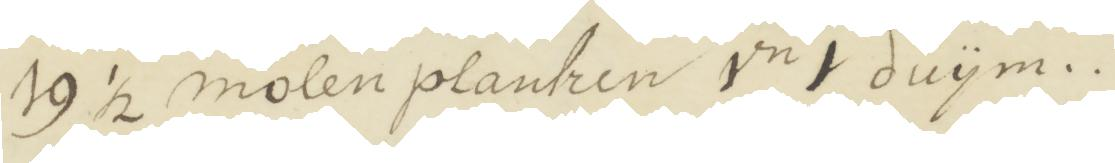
19½ molen planken vn 1 duijm . .
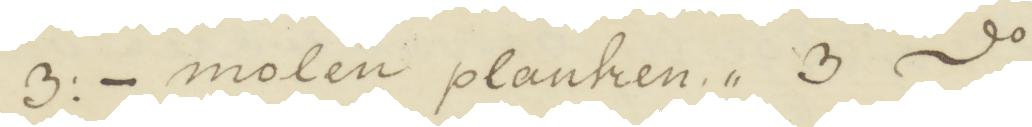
3: — molen planken, „ 3 _.o
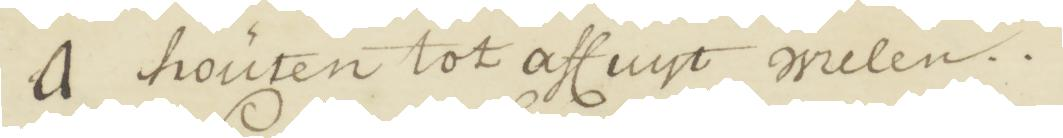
4 houten tot affuyt wielen . .
